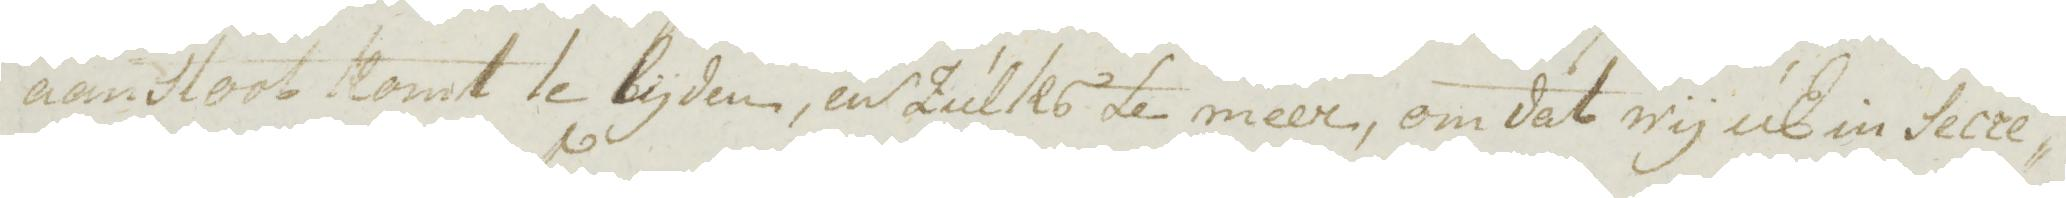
aanstoot komt te lijden, en zulks te meer, om dat wij uE in secre„
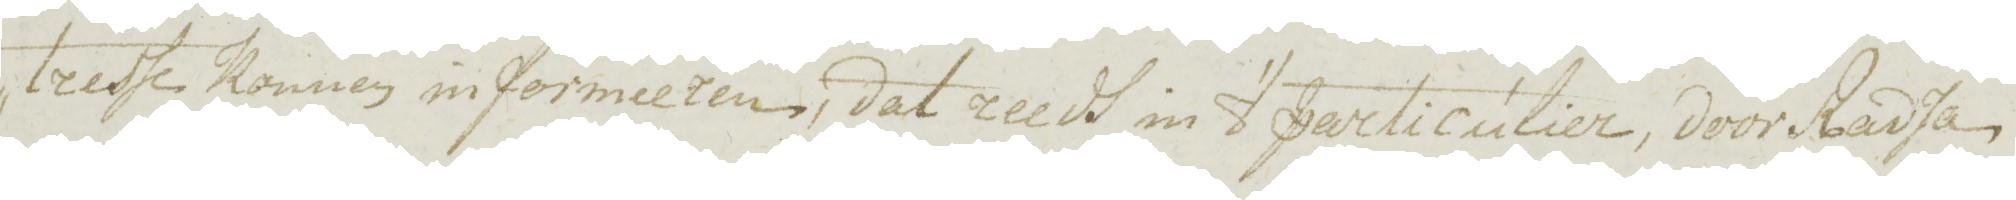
„tresse konnen informeeren, dat reeds in ’t Particulier, door Radja
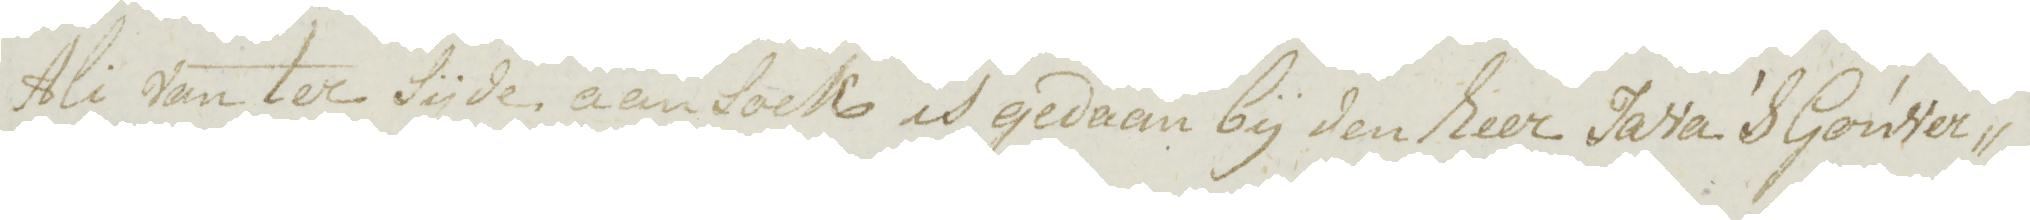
Ali van ter sijde aansoek is gedaan bij den heer Java 'S Gouver„
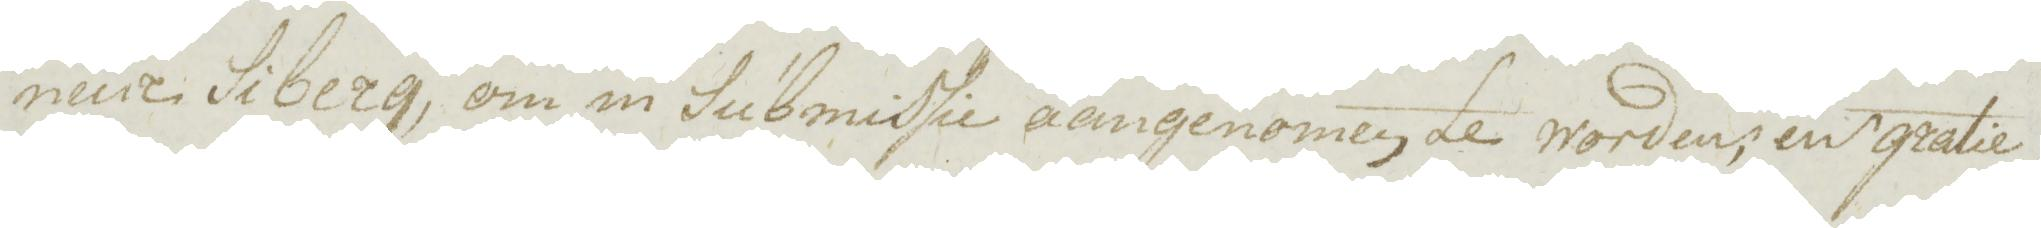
neur Siberg, om in submissie aangenomen te worden, en gratie
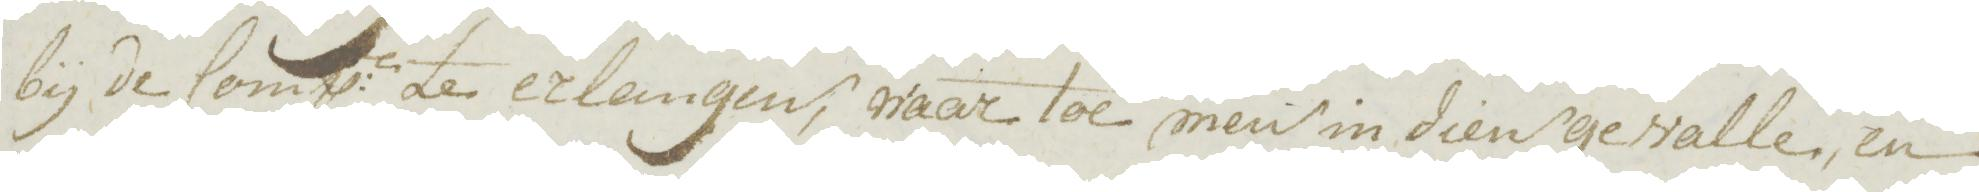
bij de Comp:e te erlangen, waar toe men in dien gevalle, en
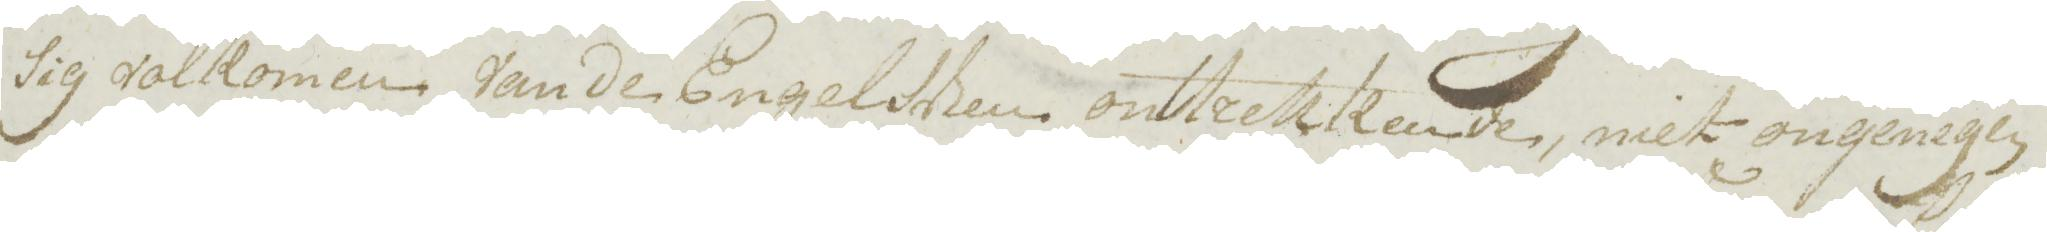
sig volkomen van de Engelschen onttrekkende, niet ongenegen
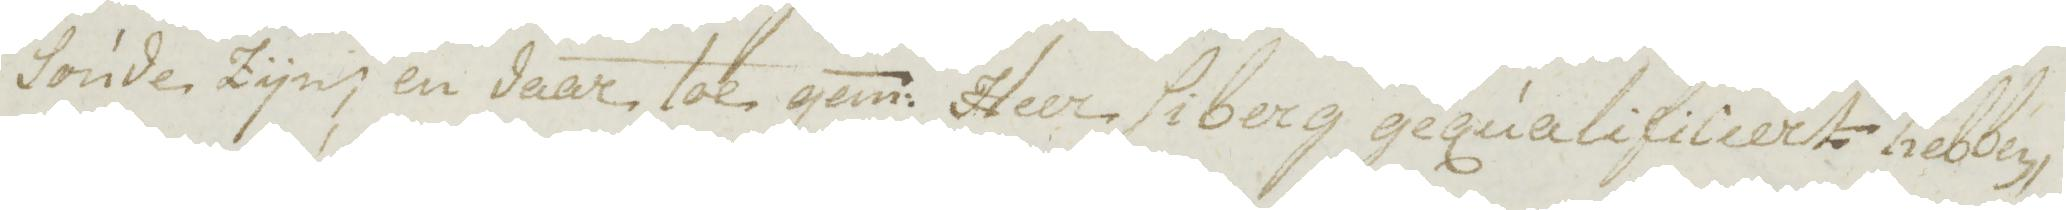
soude zijn, en daar toe gem: Heer siberg gequalificeert hebben,
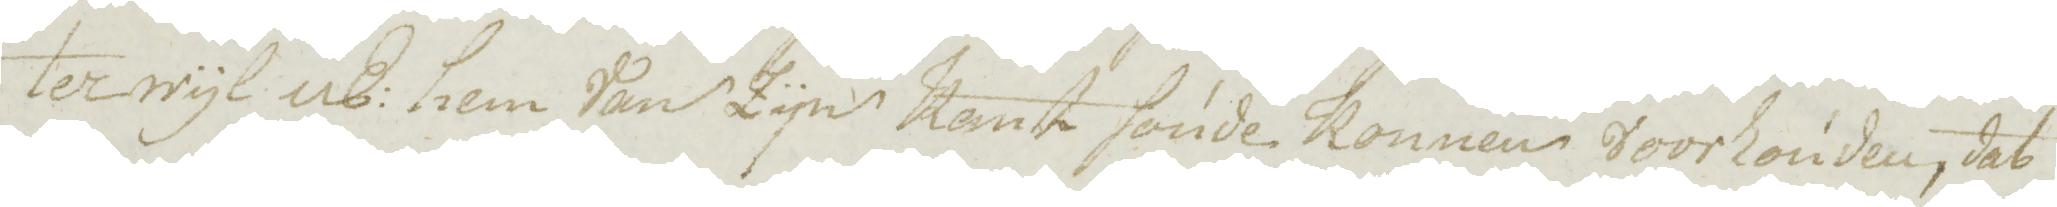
terwijl uE: hem van zijn kant soude konnen voorhouden, dat
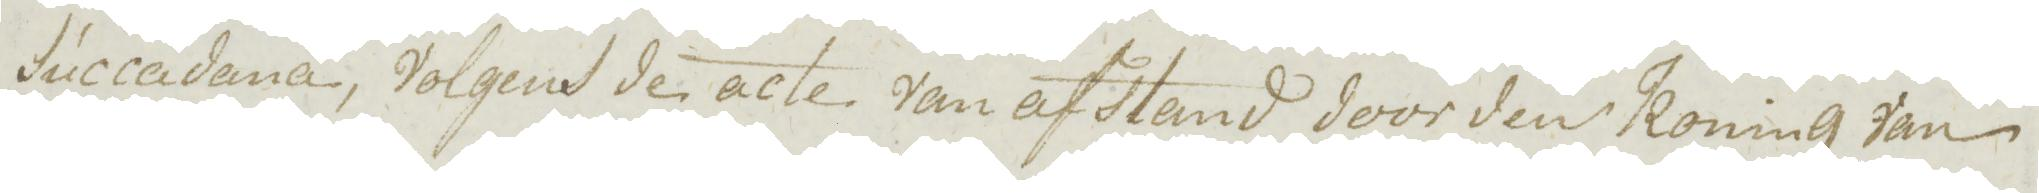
Succadana, volgens de acte van afstand door den Koning van
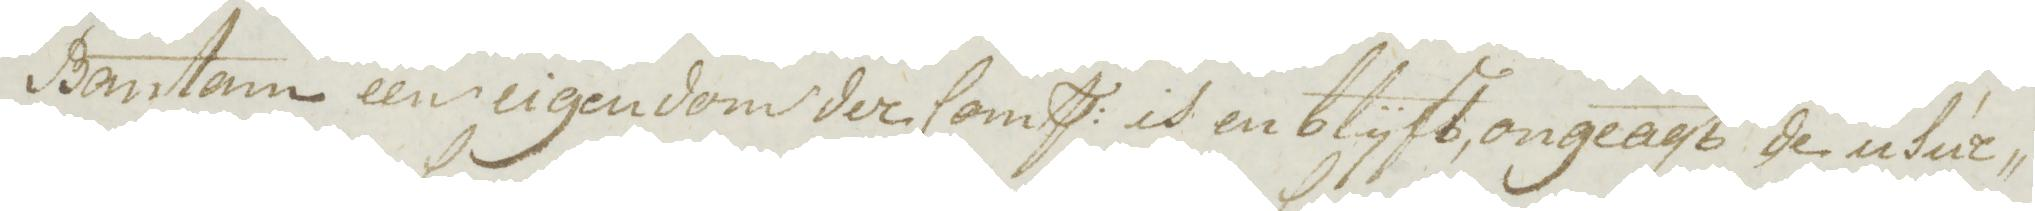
Bantam een eigendom der Comp: is en blijft, ongeagt de usur„
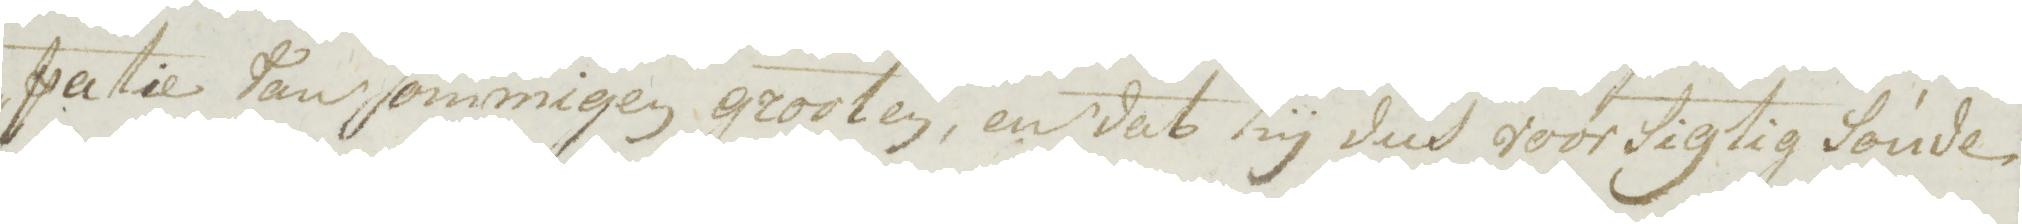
patie van sommigen grooten, en dat hij dus voorsigtig soude
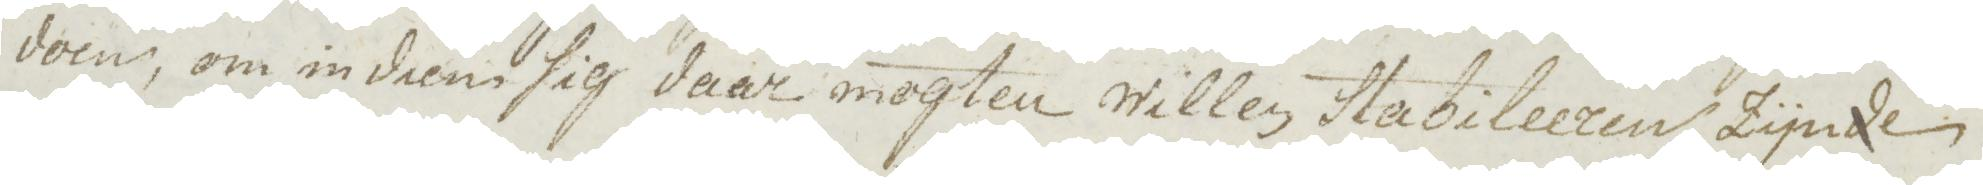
doen, om in dien sig daar mogten willen stabileeren, zijnde
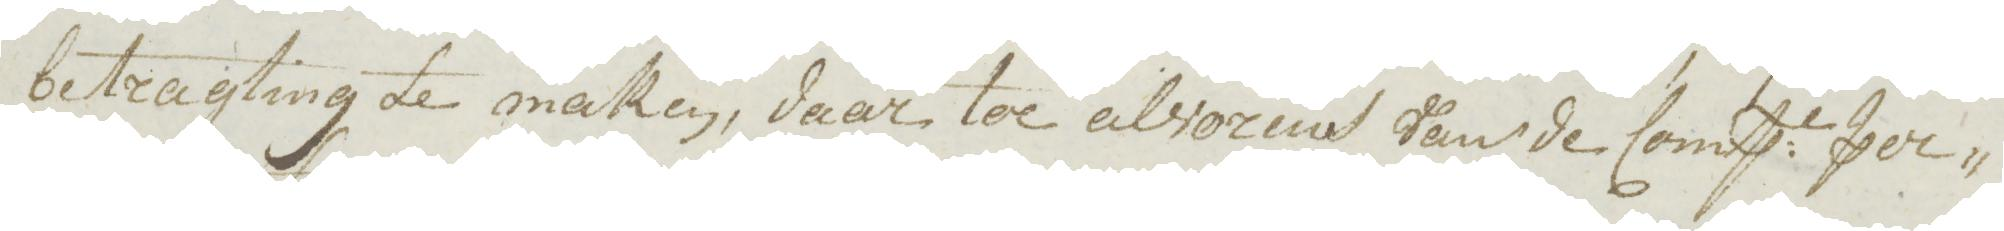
betragting te maken, daar toe alvorens van de Comp:e per„
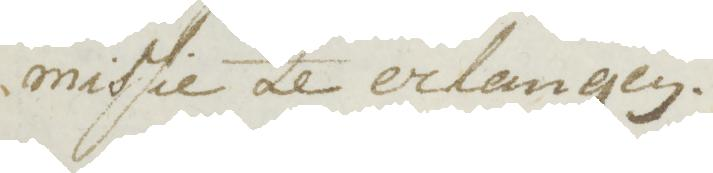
missie te erlangen.
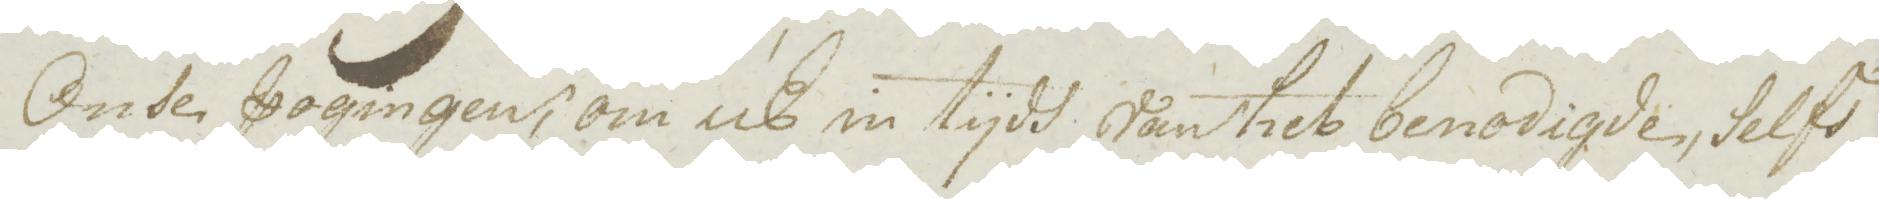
Onse pogingen, om uE in tijds van het benodigde, selfs
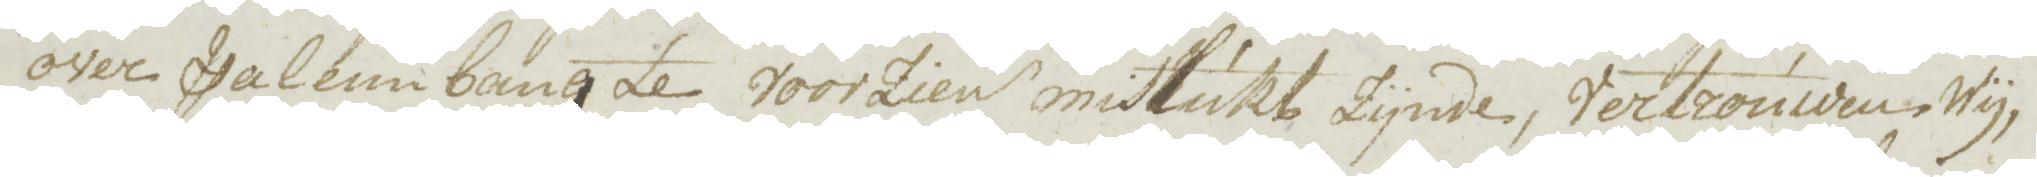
over Palemibang te voorzien mislukt zijnde, vertrouwen wij,
